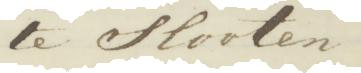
te slooten
